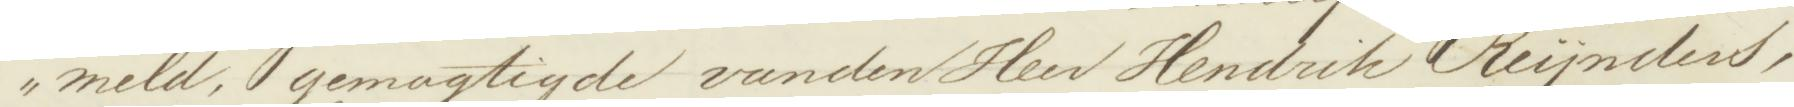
„meld, gemagtigde van den Heer Hendrik Reijnders,
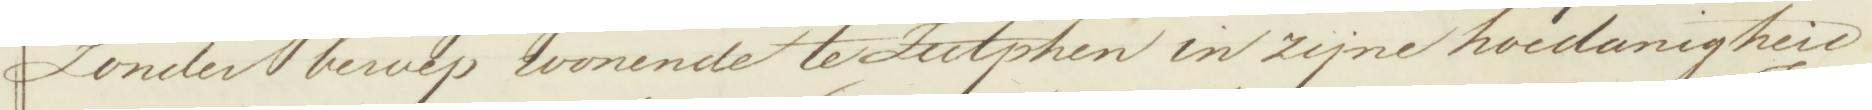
zonder beroep wonende te Zutphen in zijne hoedanigheid
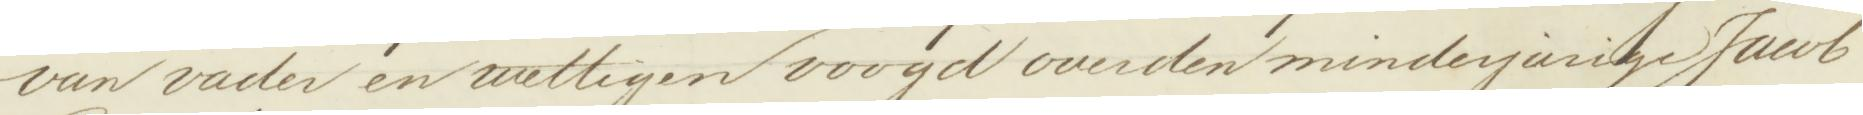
van vader en wettigen voogd overden minderjarige Jacob
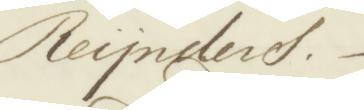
Reijnders.-
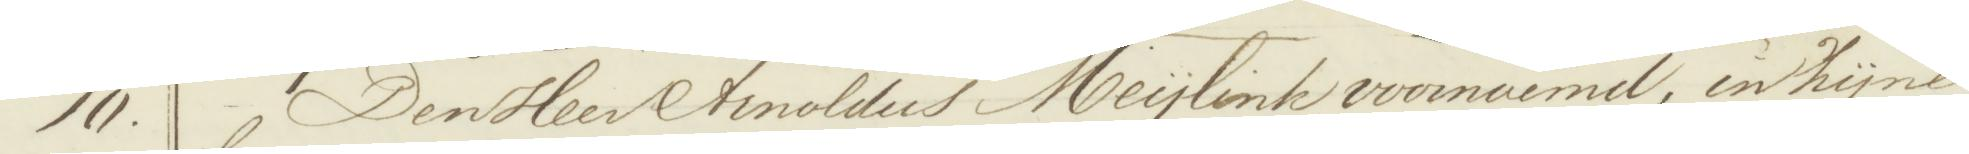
10. Den Heer Arnoldus Meijlink voornoemd, in zijne
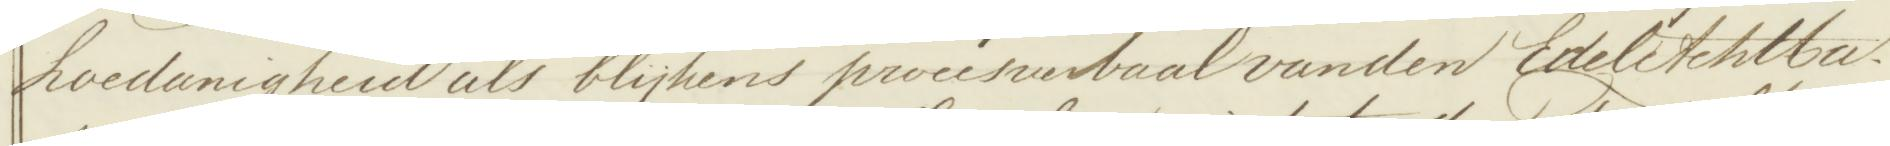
hoedanigheid als blijkens proces verbaal vanden EdeleAchtba„
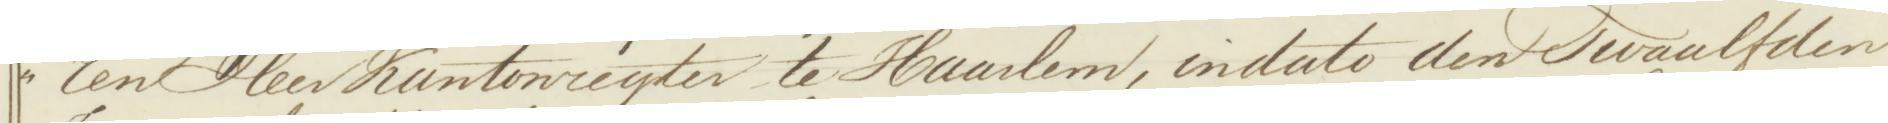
„ ren Heer Kantonregter te Haarlem, in dato den Twaalfden
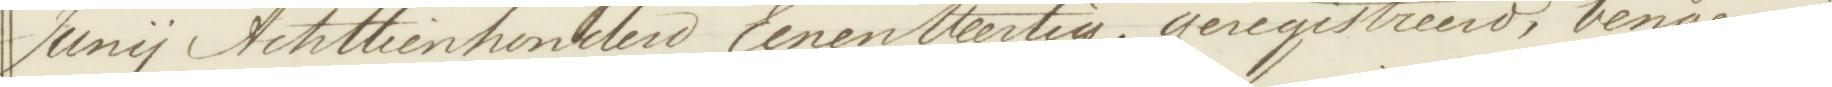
Junij Achttienhonderd EenenVeertig, geregistreerd, benoemd
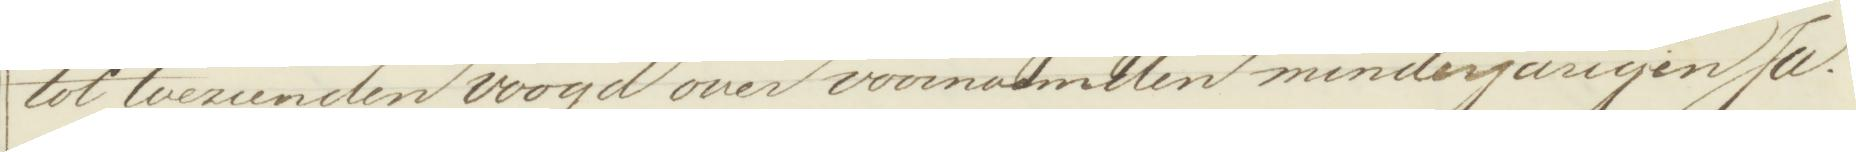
tot toezienden voogd over voornoemden minderjarigen Ja.
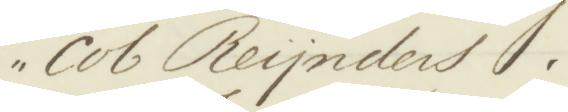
„cob Reijnders.
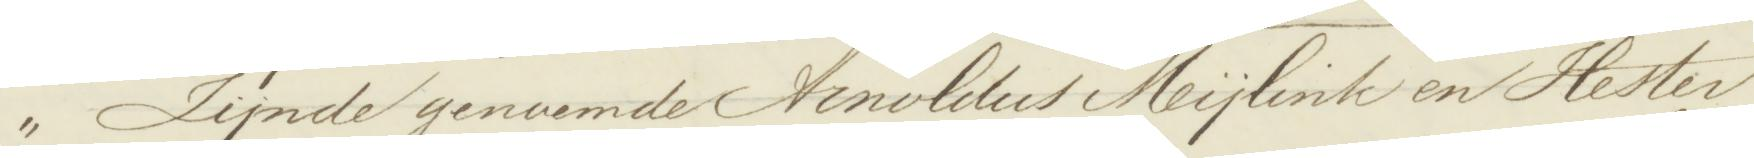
„ Zijnde genoemde Arnoldus Meijlink en Hester
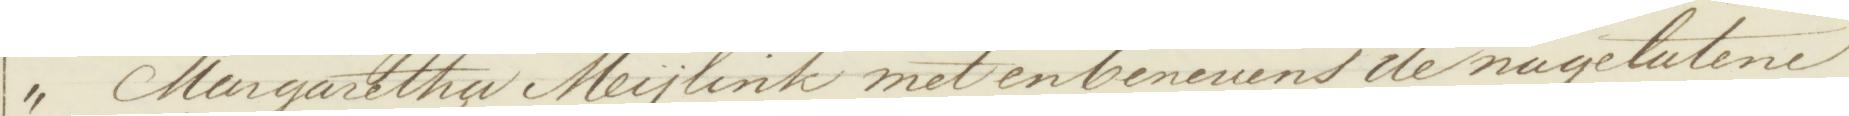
„ Margaretha Meijlink met enbenevens de nagelatene
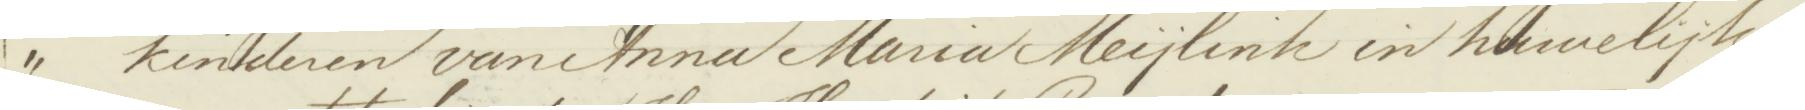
„ kinderen van Anna Maria Meijlink in huwelijk
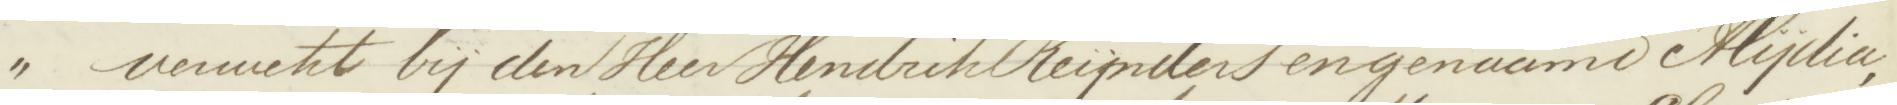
„ verwekt bij den Heer Hendrik Reijnders engenaamd Alijdia,
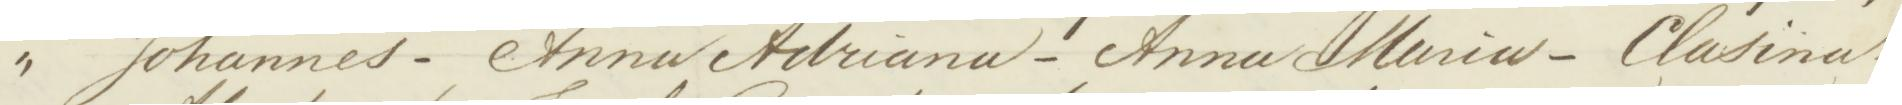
„ Johannes - Anna Adriana - Anna Maria - Clasina -
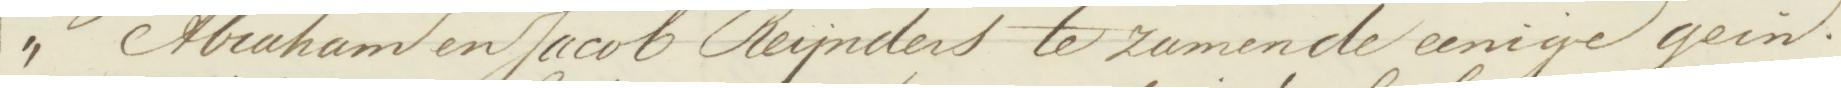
„ Abraham en Jacob Reijnders te zamende eenige gein.
